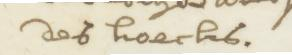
des koecks.
